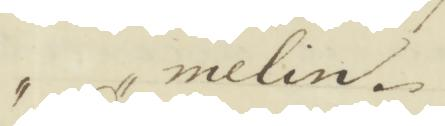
„ „ melin.
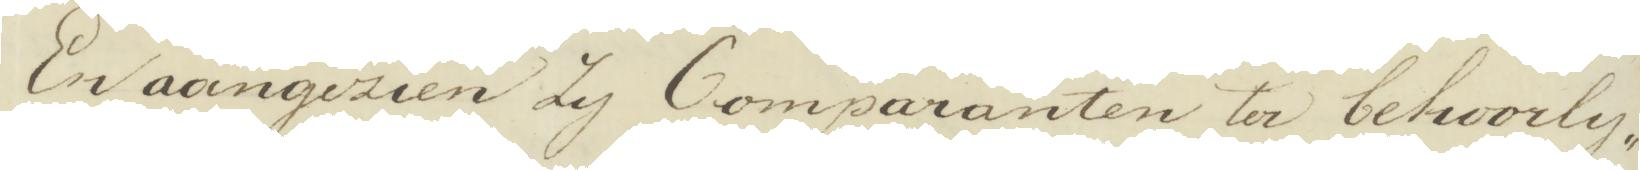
En aangezien zy comparanten ter behoorly„
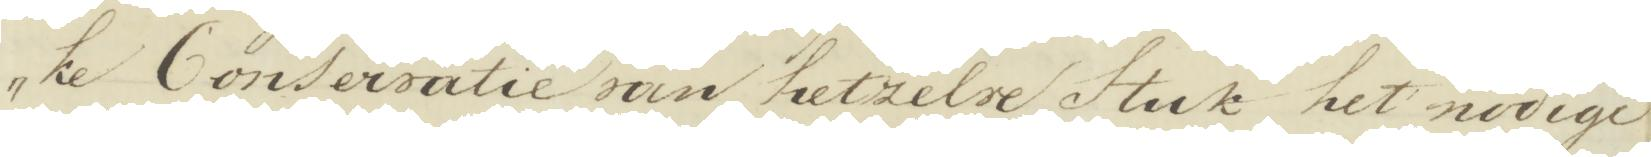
„ke conservatie van hetzelve stuk het nodige
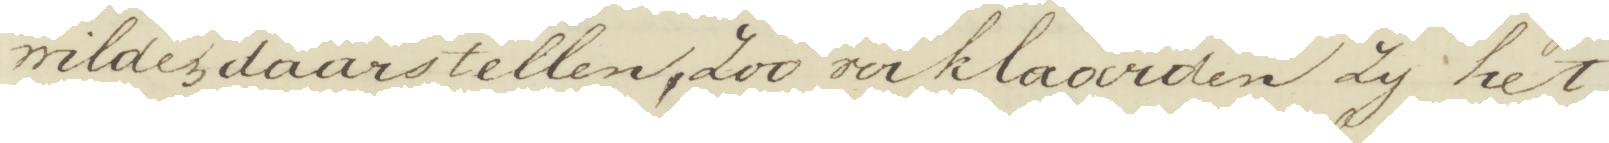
wilden daarstellen, zoo verklaarden zy het
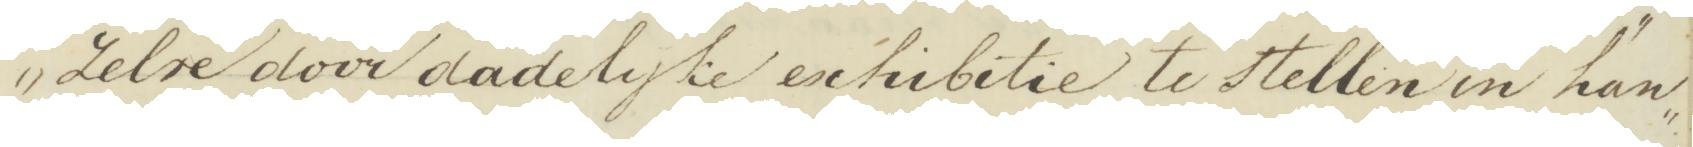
„zelve door dadelyke exhibitie te stellen in han„
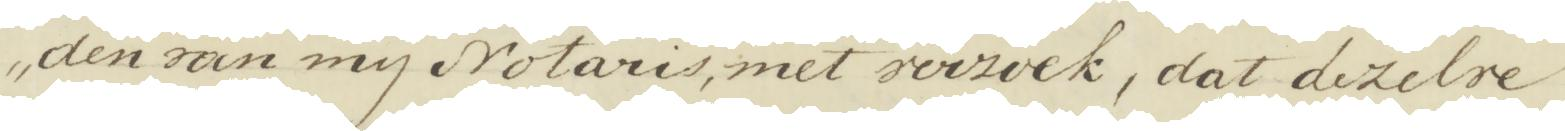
„den van my Notaris, met verzoek, dat dezelve
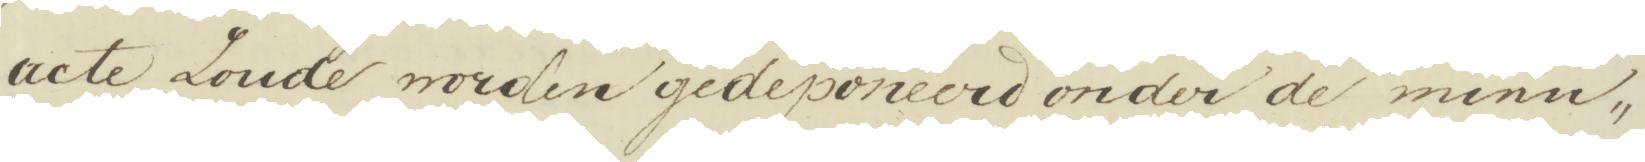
acte zoude worden gedeponeerd onder de minu„
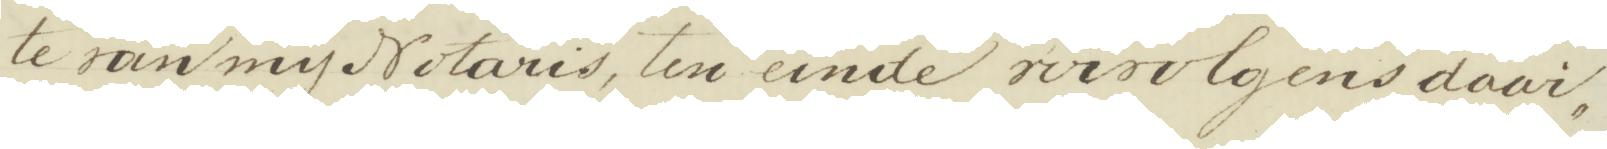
te van my Notaris, ten einde vervolgens daar„
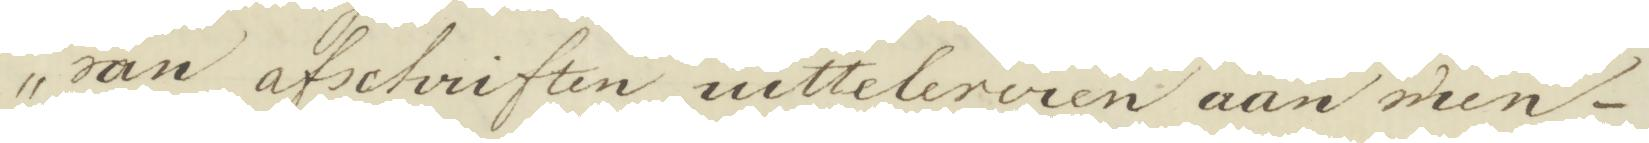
„ van afschriften uitteleveren aan wien –
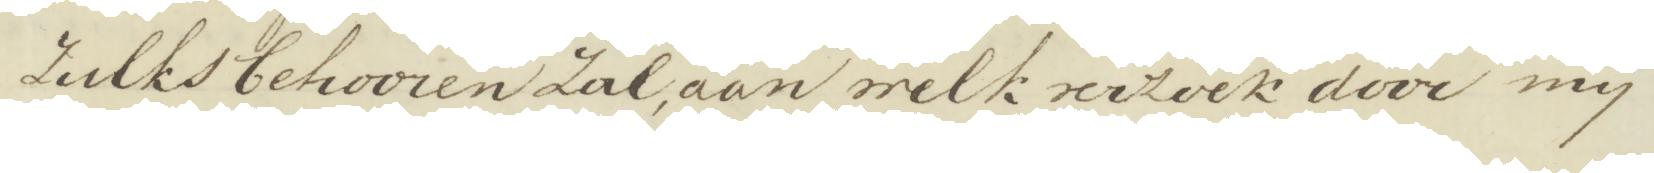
zulks behooren zal, aan welk verzoek door my
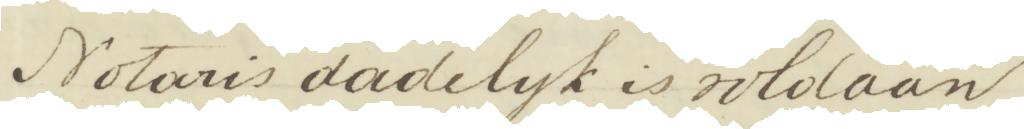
Notaris dadelyk is voldaan
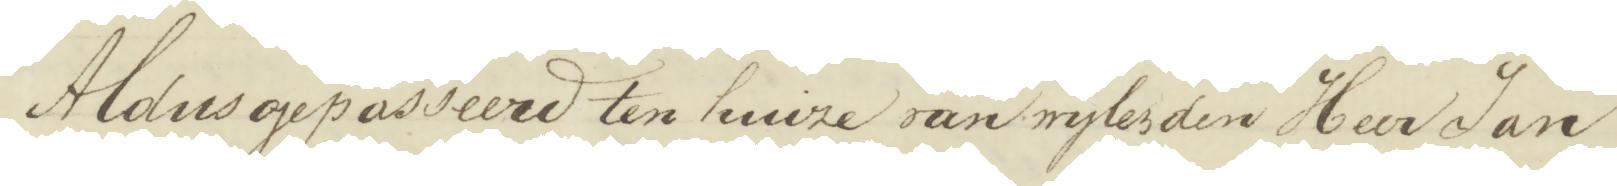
Aldus gepasseerd ten huize van wylen den Heer Jan
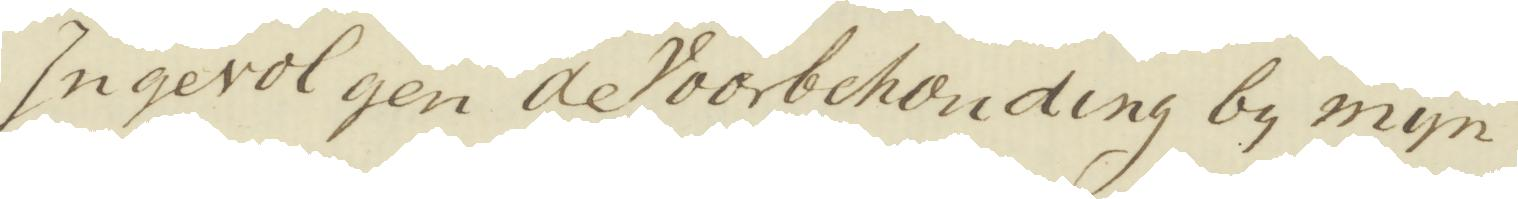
In gevolgen de Voorbehouding by myn
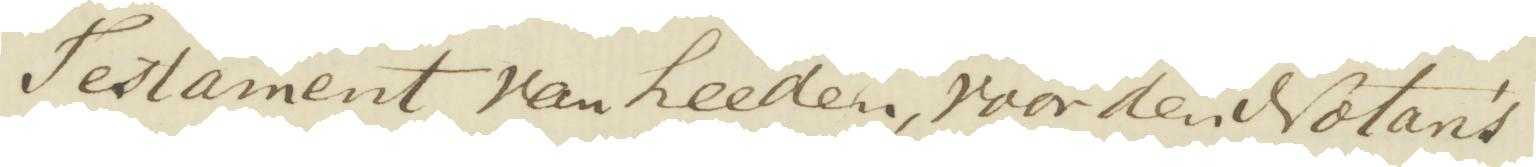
Testament van heeden, voor den Notaris
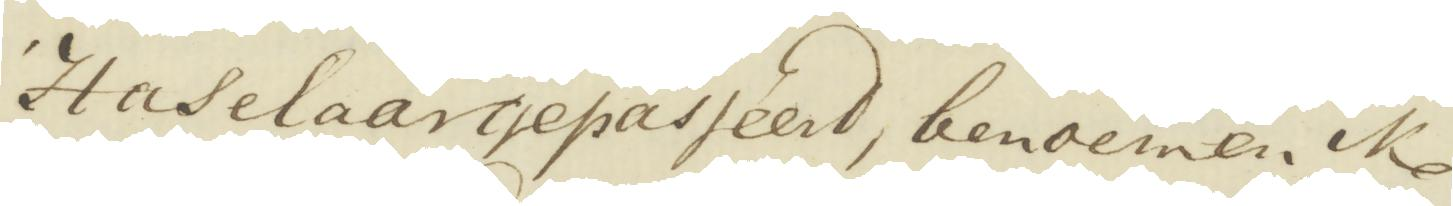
'Haselaar gepasseerd, benoemen ik
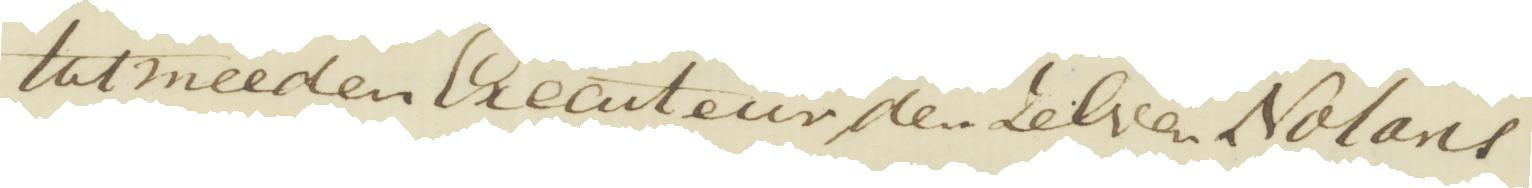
tot meeden Executeur den zelven Notaris
